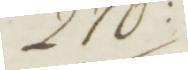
270:
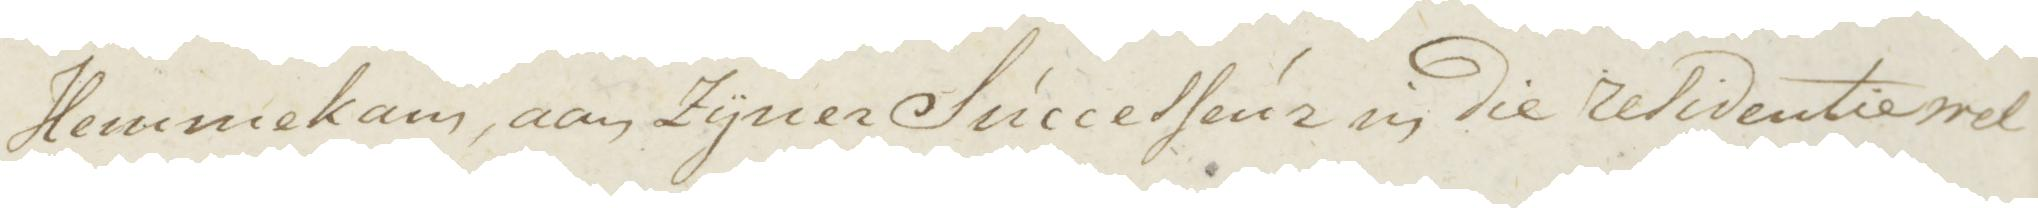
Hemmekam, aan zijner Successeur in die residentie wel
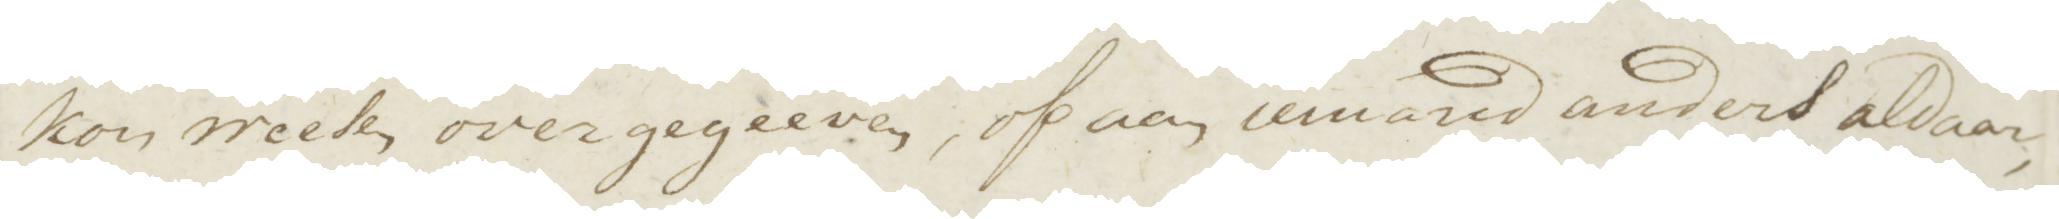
kon weesen overgegeeven, of aan iemand anders aldaar,
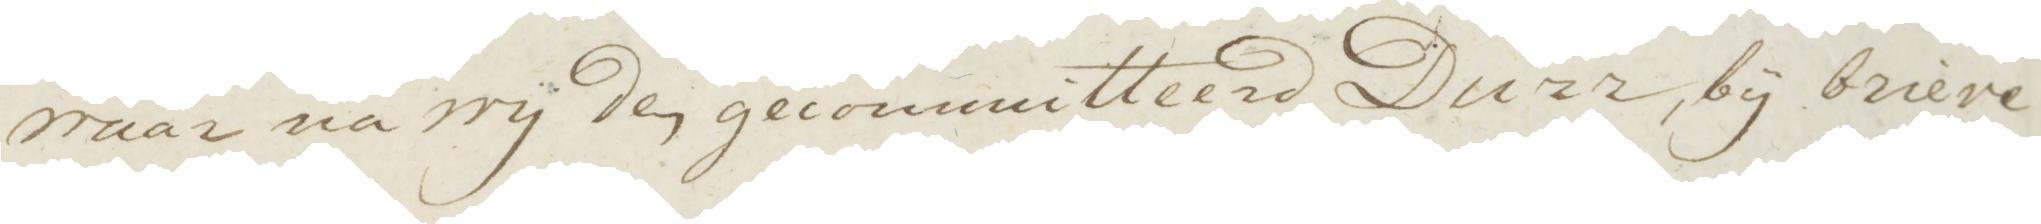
waar na wij den gecommitteerd Durr, bij brieve
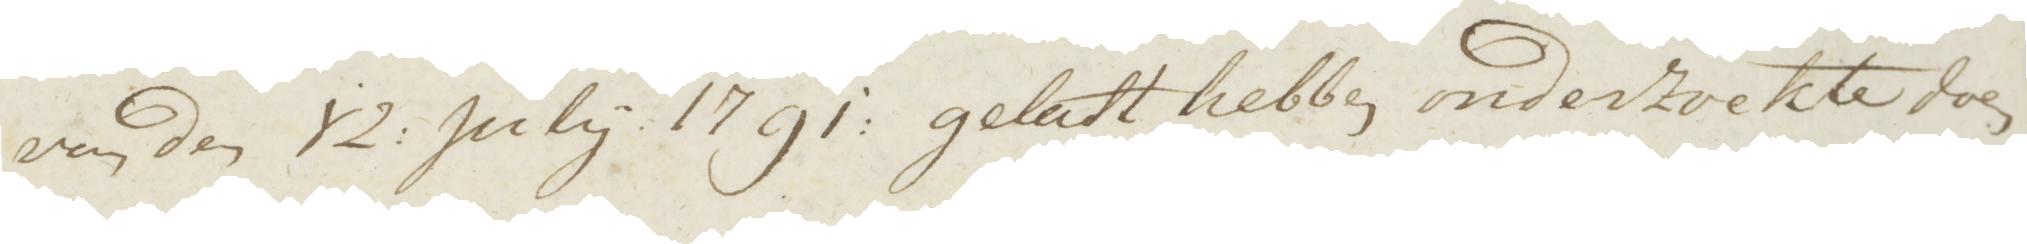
van den 12: Julij: 1791: gelast hebben onderzoekte doen
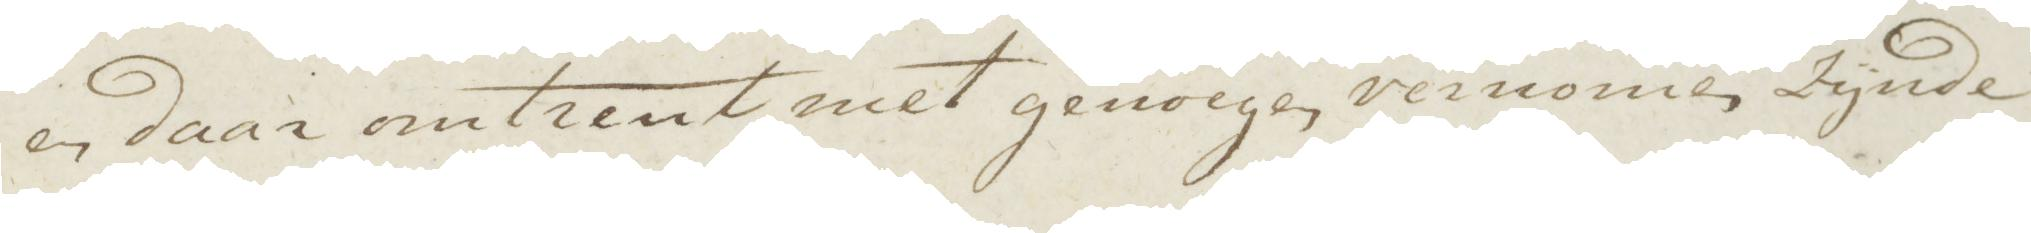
en daar omtrent met genoegen vernomen zijnde
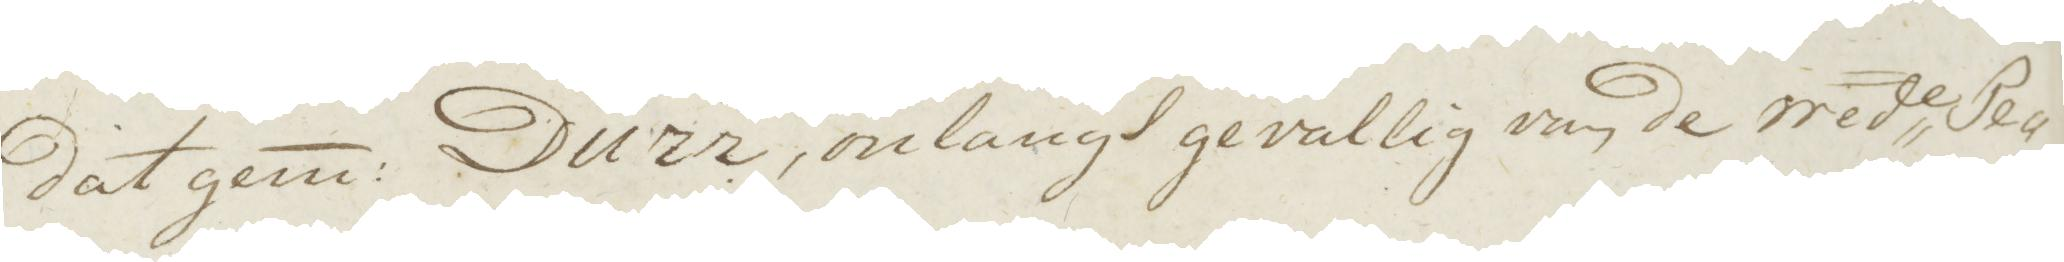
dat gem: Durr, onlangs gevallig van de wed„e Pe
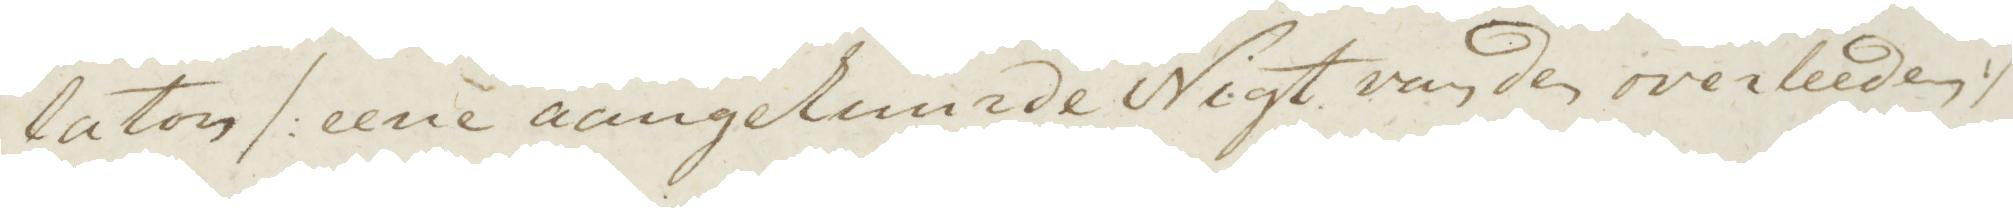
laton /:eene aangehuurde Nigt van den overleeden:/
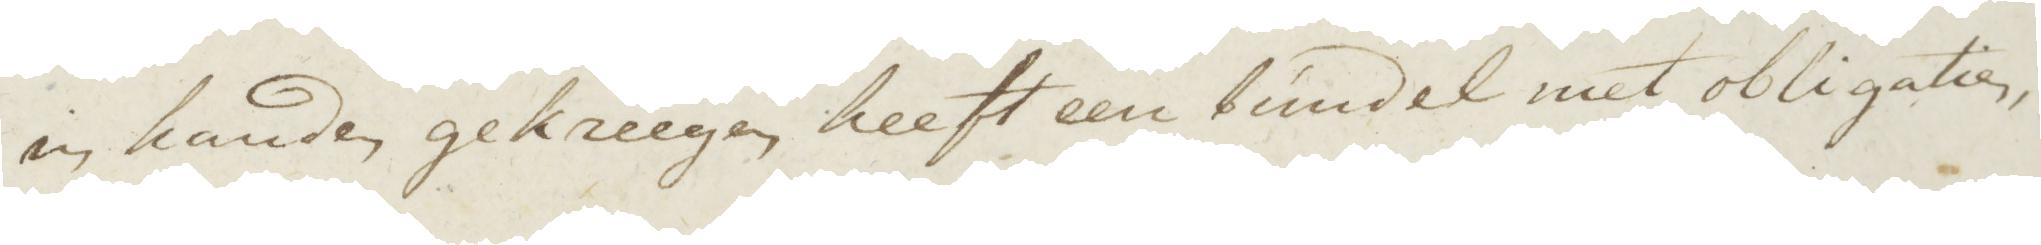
in handen gekreegen heeft een bundel met obligatien,
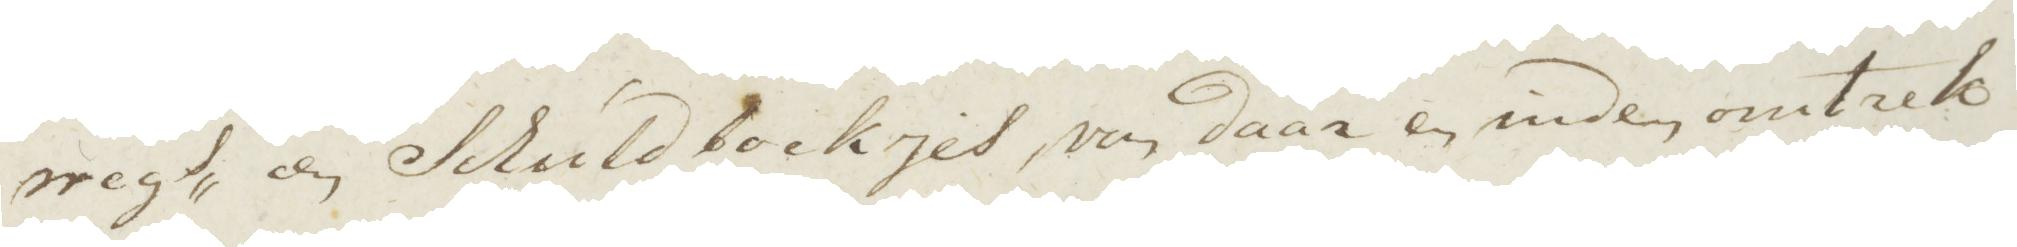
weg„s en schuldboekjes, van daar en inden omtrek
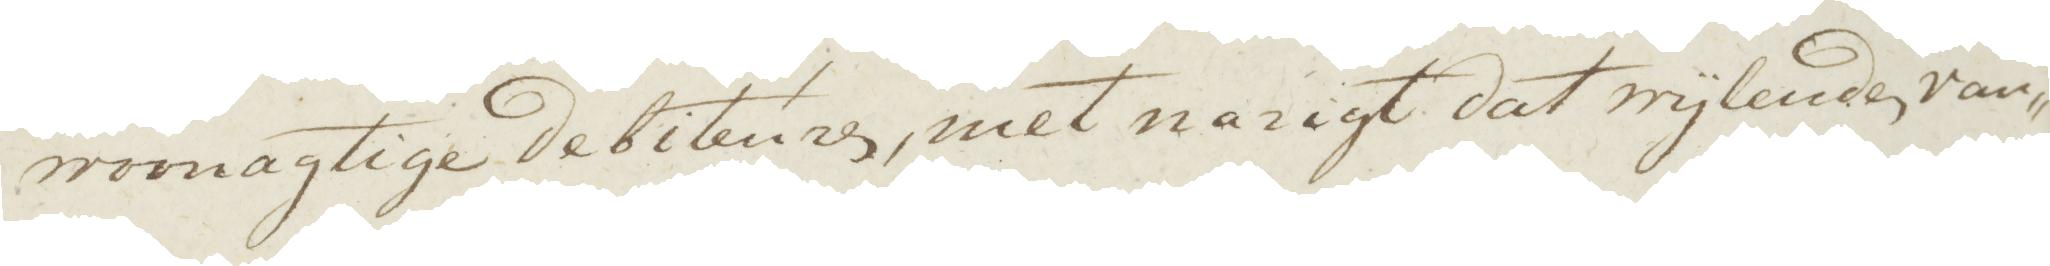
woonagtige debiteuren, met narigt dat wijlenden van„
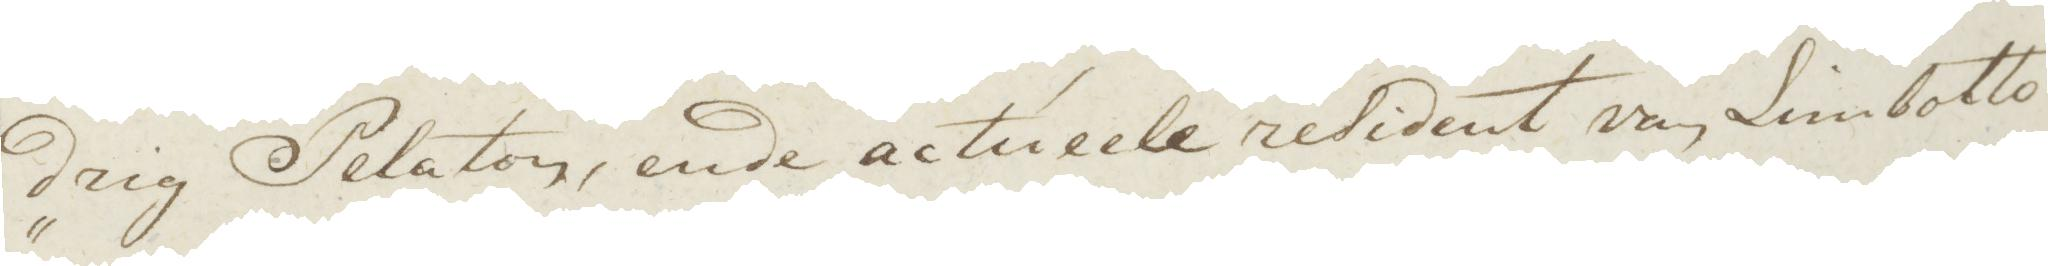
drig Pelaton, ende actueele resident van Limbotto
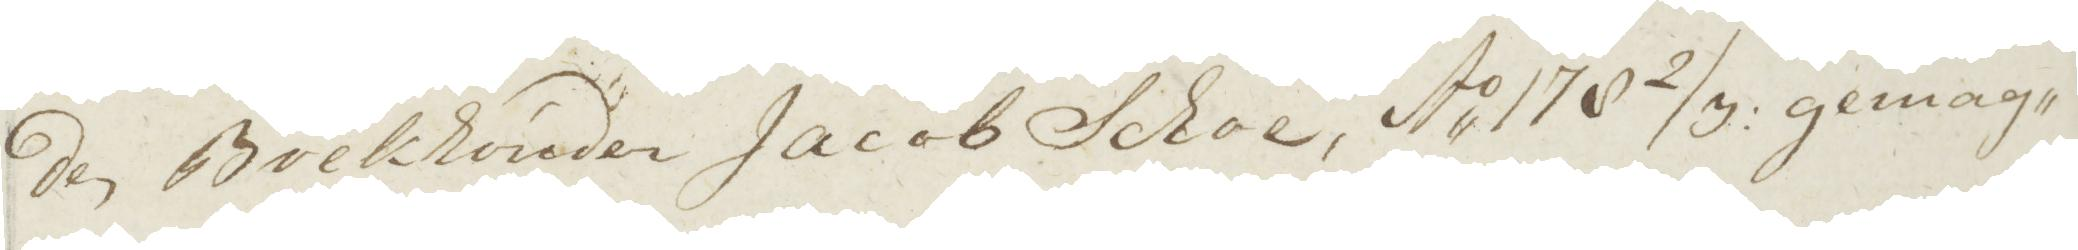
den Boekhouder Jacob Schoe, A„o 1782/3: gemag„
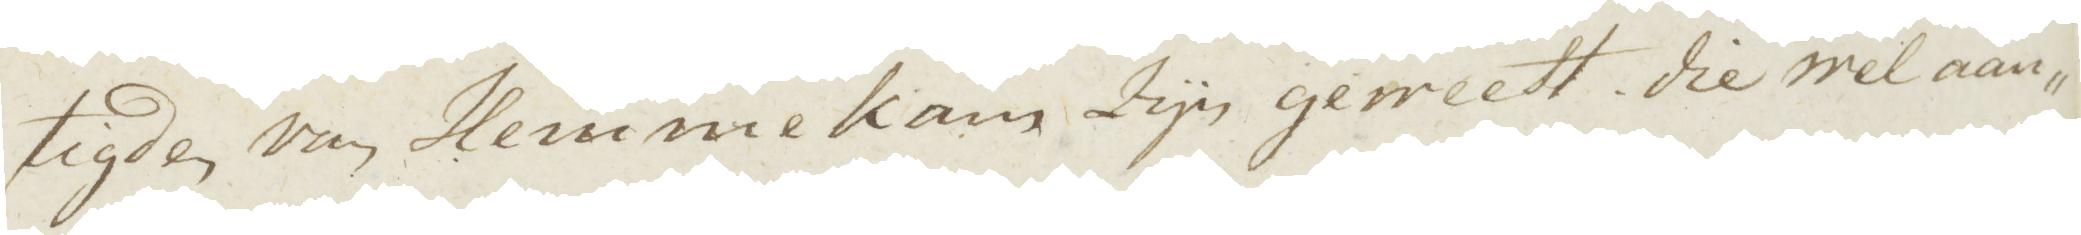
tigden van Hemmekam zijn geweest, die wel aan„
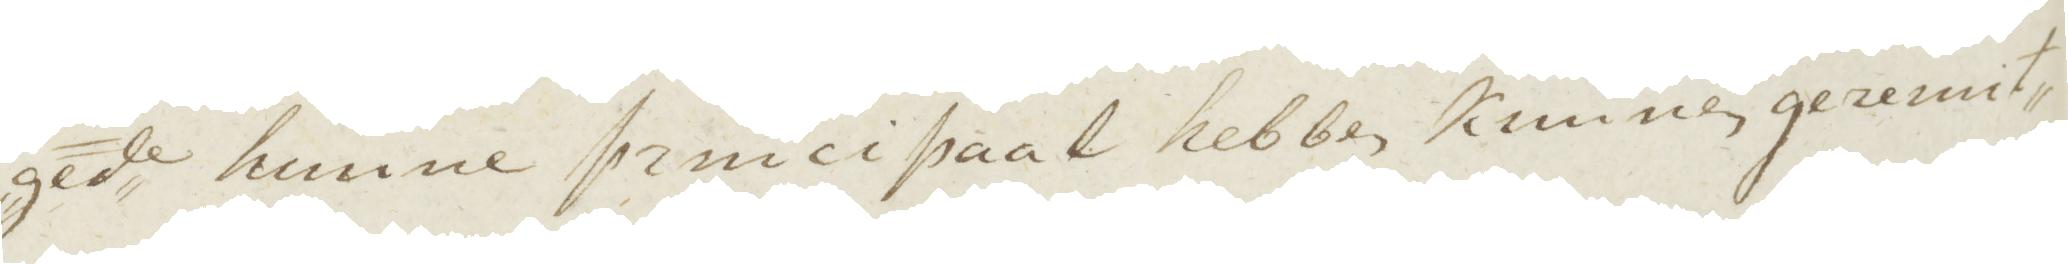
ged„e hunne principaal hebben kunnen geremit„
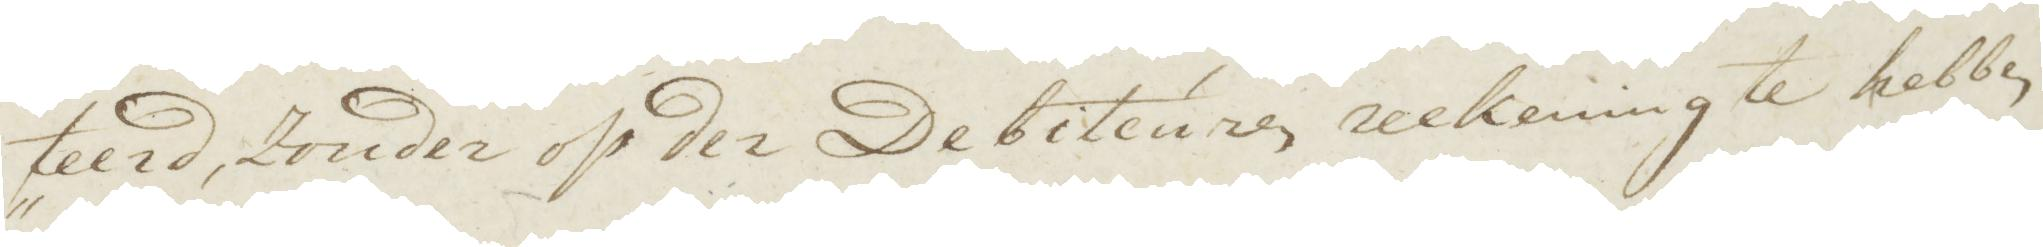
teerd, zonder op der Debiteuren reekening te hebben
